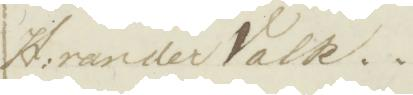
H: van der Valk.
